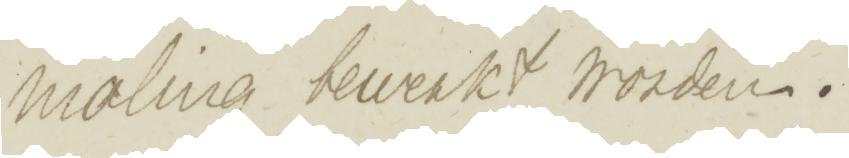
maling bewerkt worden.
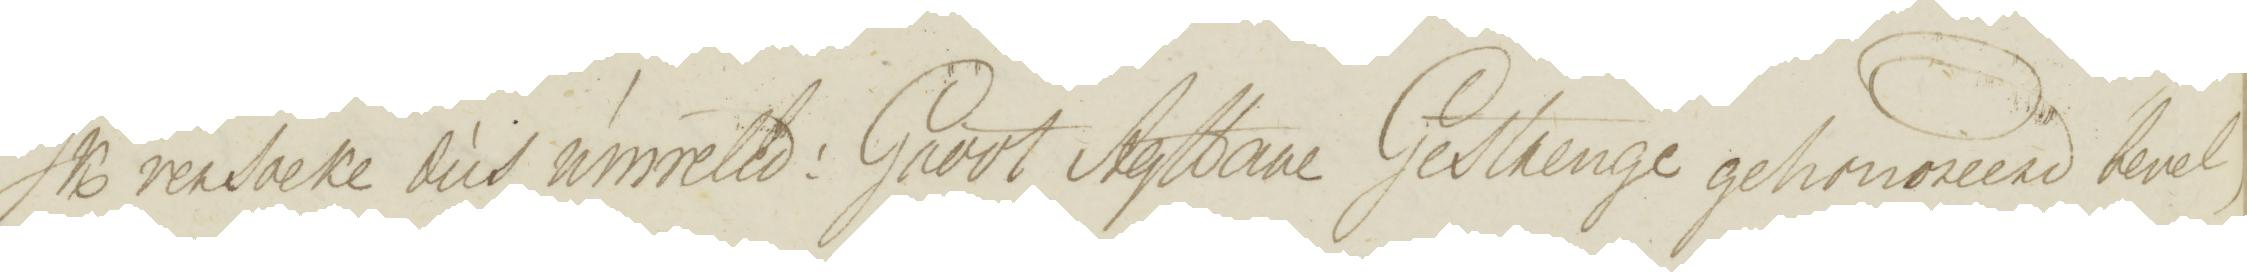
Ik versoeke dus uwwelEd: Groot Agtbare Gestrenge gehonoreerd bevel,
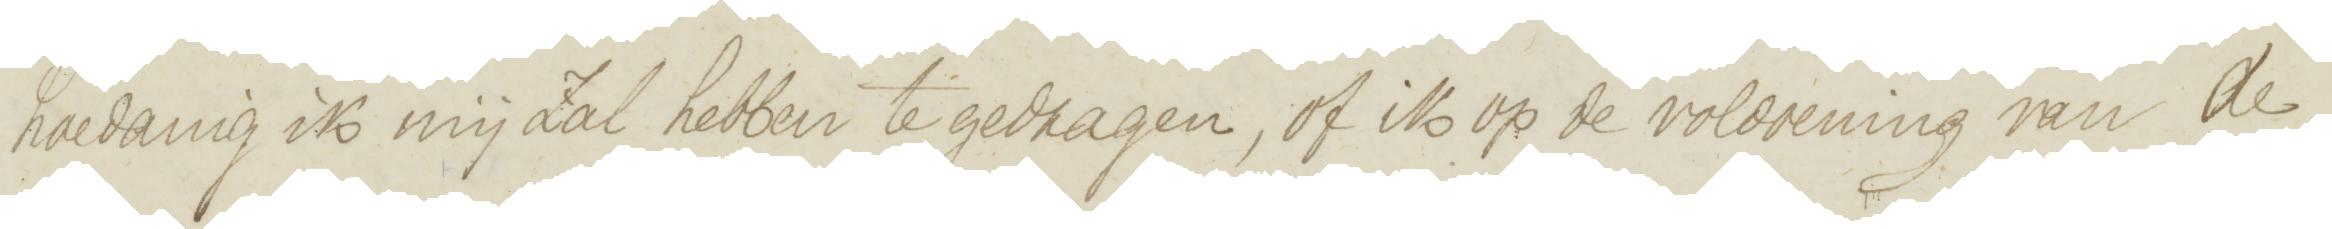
hoedanig ik mij zal hebben te gedragen, of ik op de voldoening van de
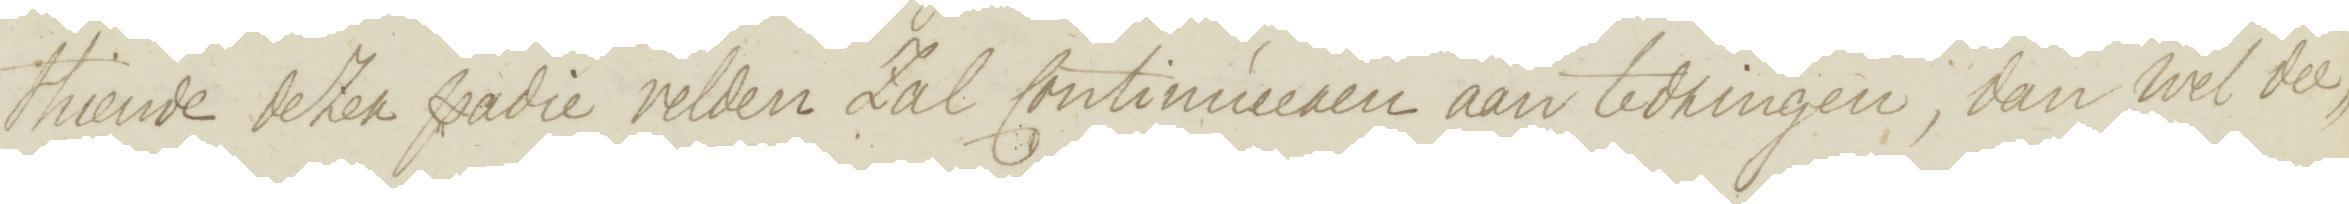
thiende dezer padie velden zal continueeren aan tedringen; dan wel dee
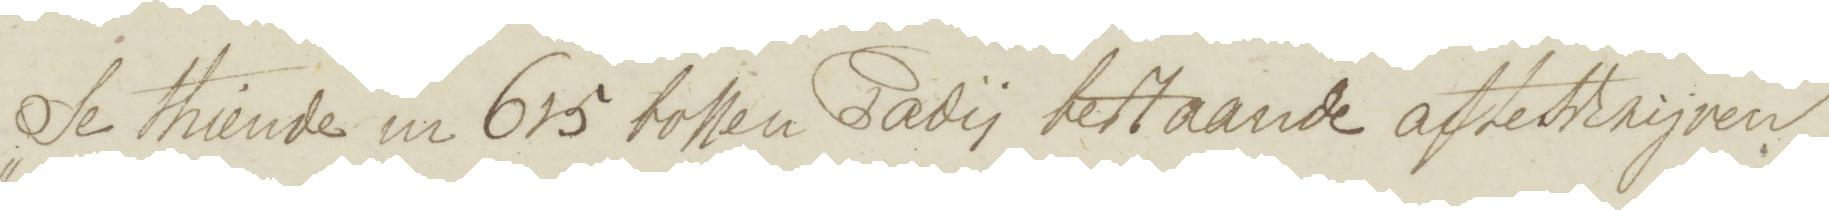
„se thiende in 615 bossen Padij bestaande afteschrijven.
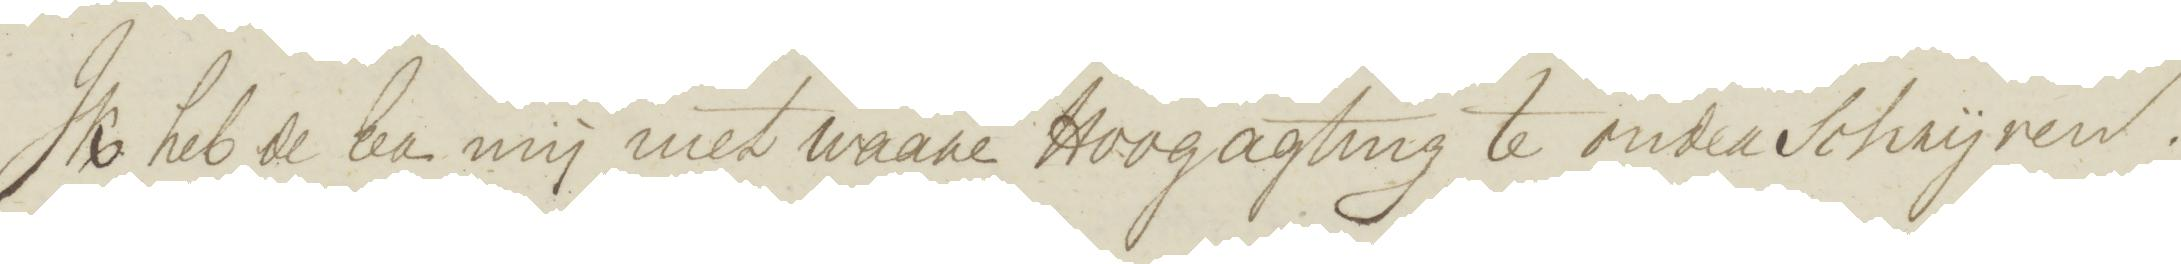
Ik heb de Eer mij met waare Hoogagting te onderschrijven
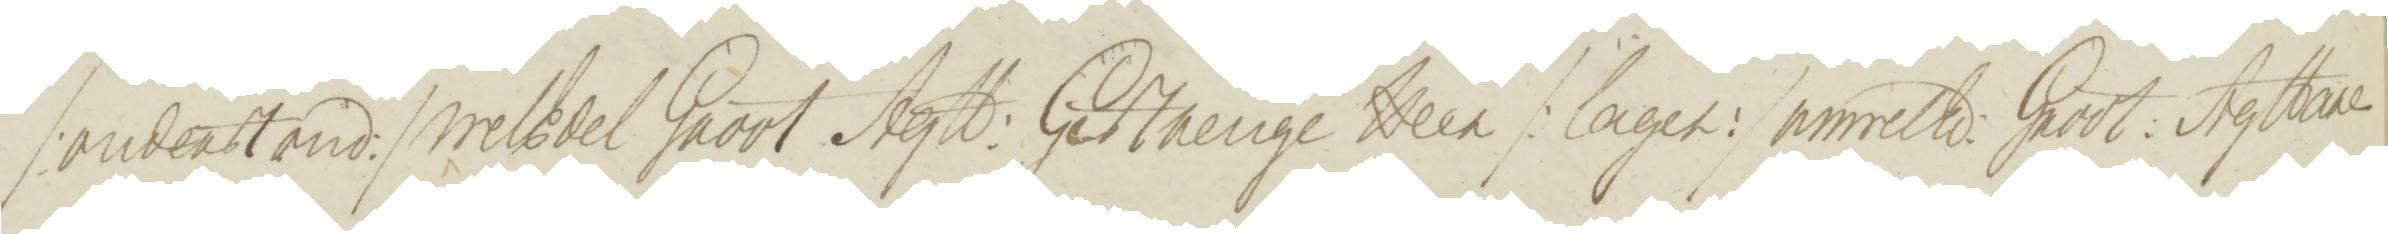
/:onderstond:/ welEdel Groot Agtb: Gestrenge Heer /:lager:/ uwwelEd: Groot: Agtbare
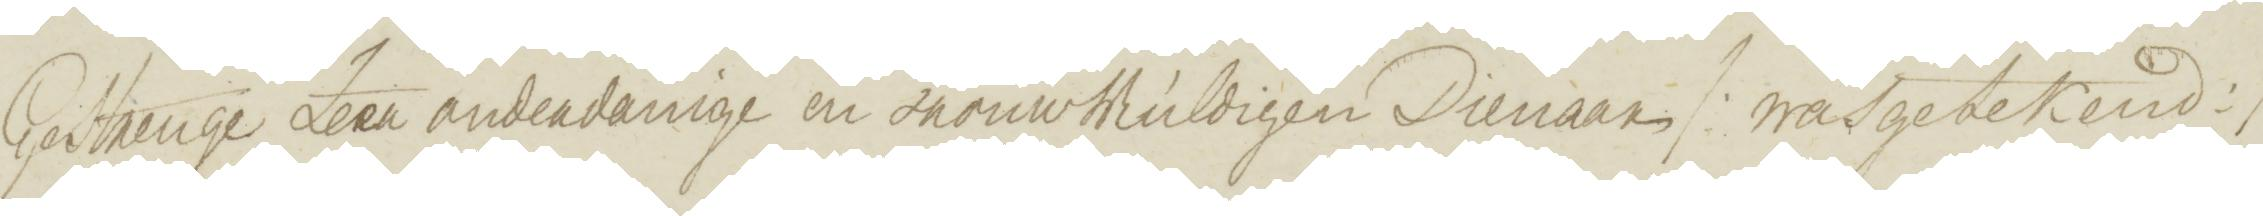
Gestrenge Zeer onderdanige en Trouwschuldigen Dienaar /:was getekend:
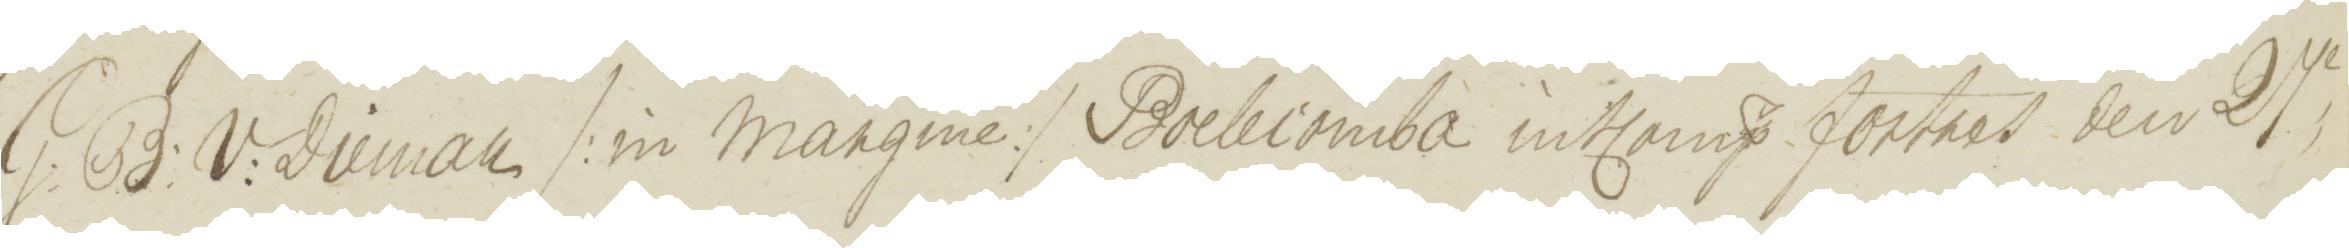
G: B: V: Diemar /:in margine:/ Boelecomba in sComp: fortres den 27„e
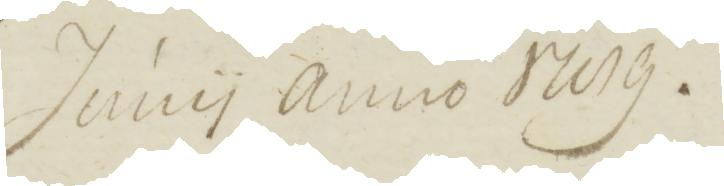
Iunij anno 1789.
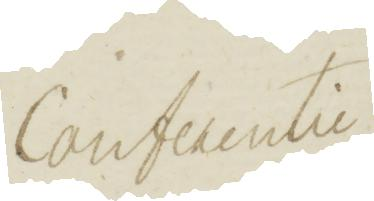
Conferentie
